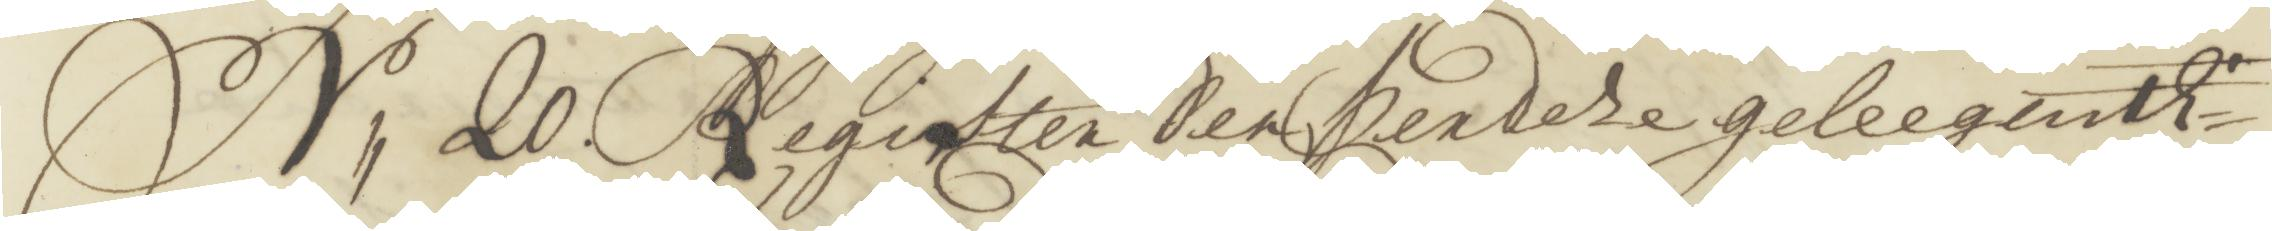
N„o 20. Register der per deze geleegenth=t
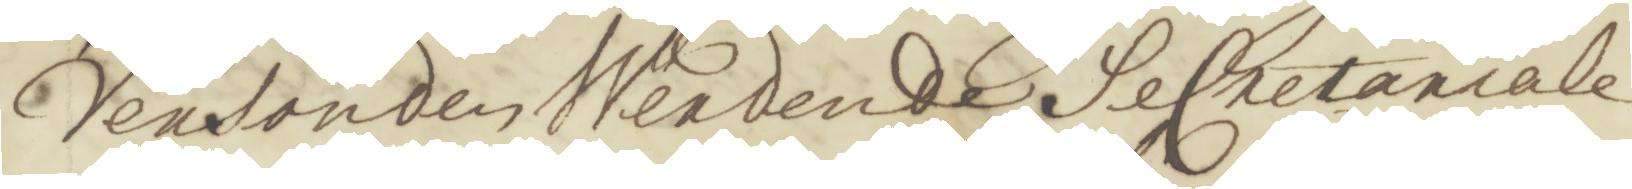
Versonden Werdende seCretariale
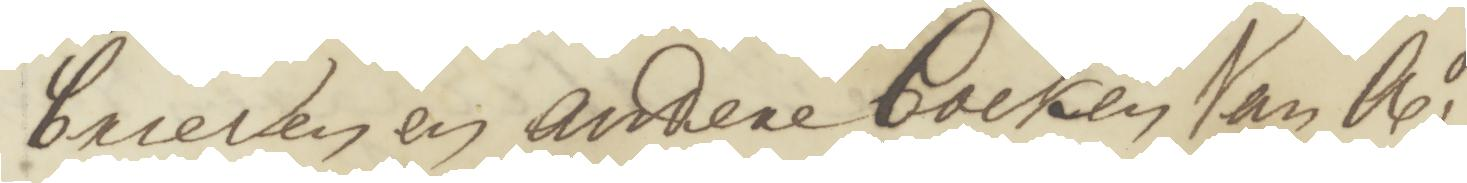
brieven en andere boeken van A„o
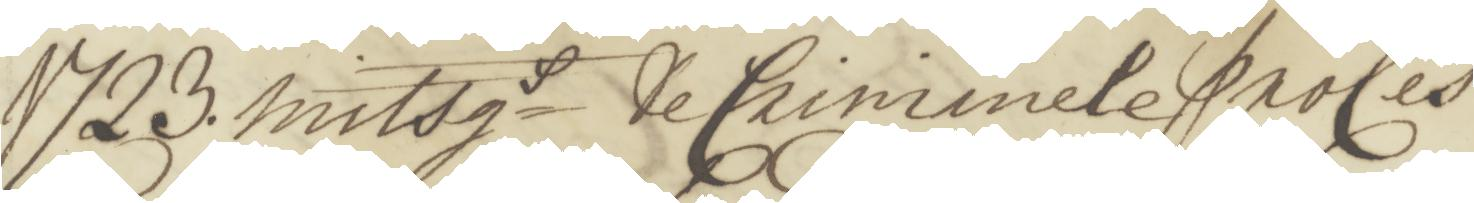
1723. mitsg=s de Criminele proCes
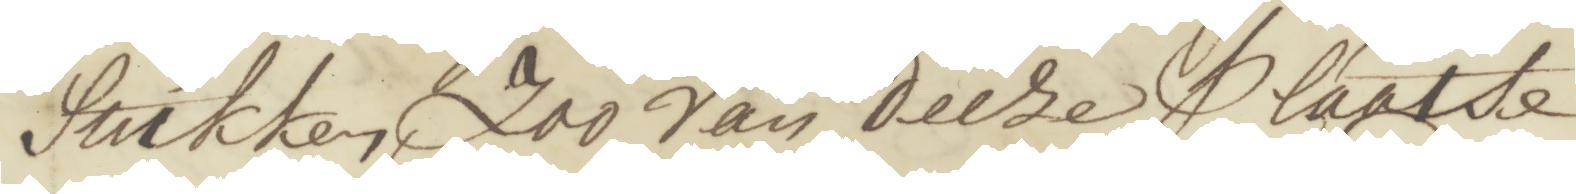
stukken, zoo van deeze plaatse
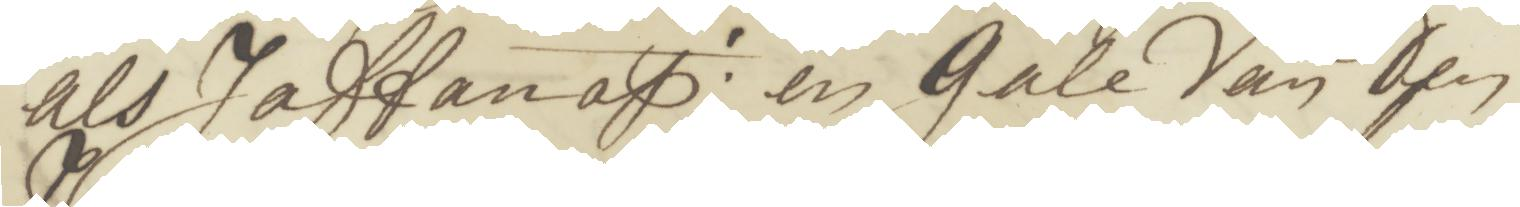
als Jaffanap: en gale van den
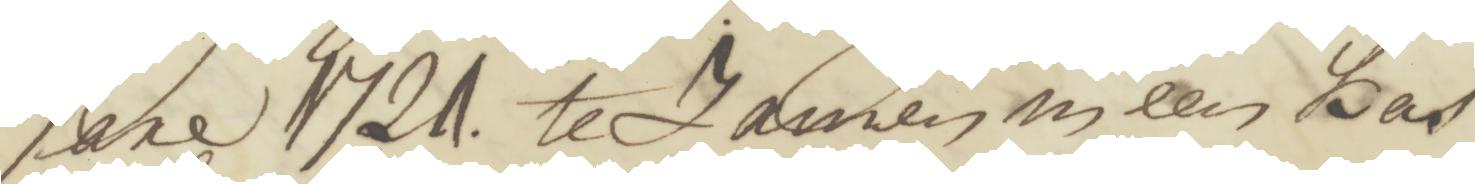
Jare 1724. te zamen in een kas
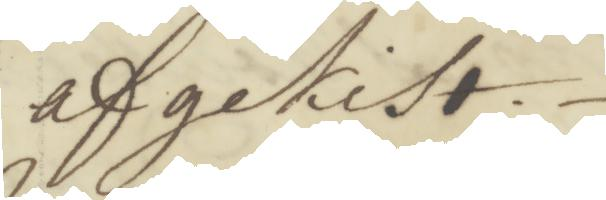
afgekist.
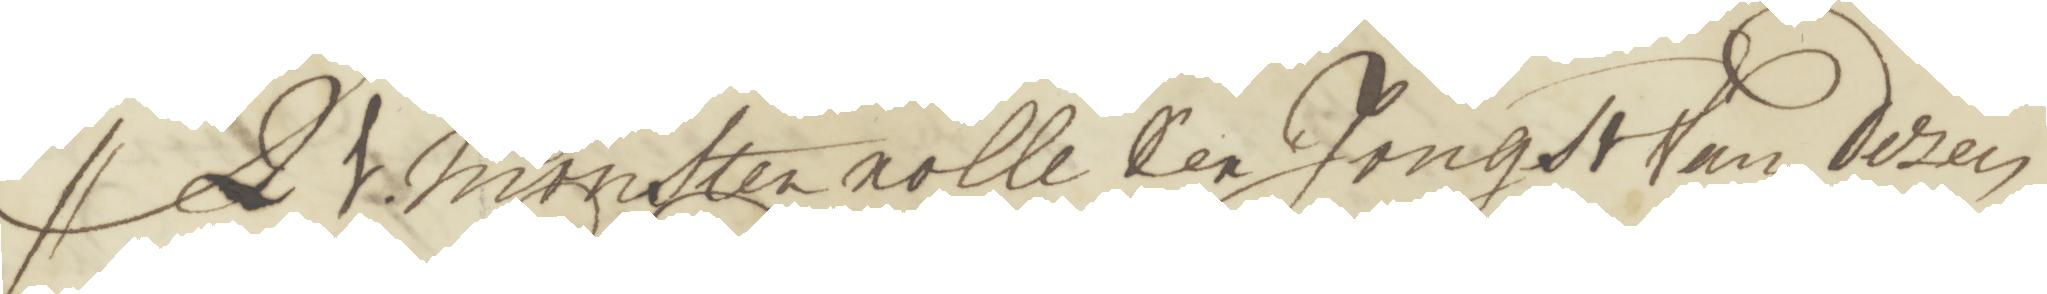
„ 21. monster rolle der Jongst van dezen
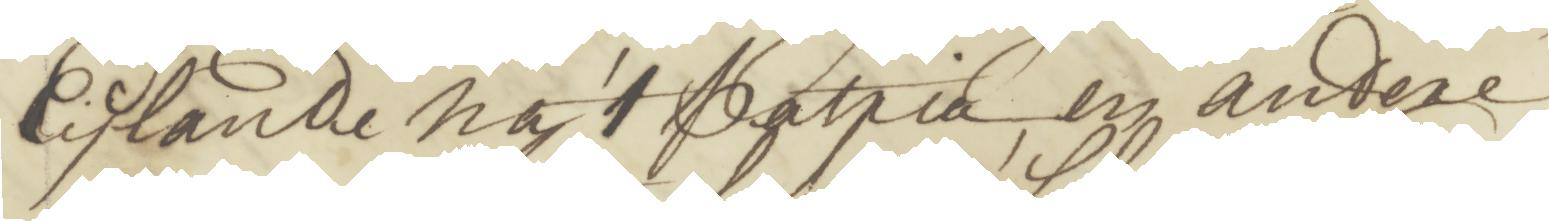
Eijlande na ’t Patria, en andere
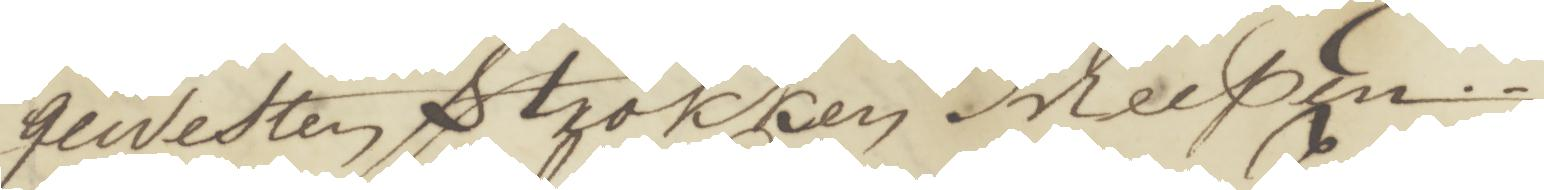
gewesten vertrokken scheepen.-
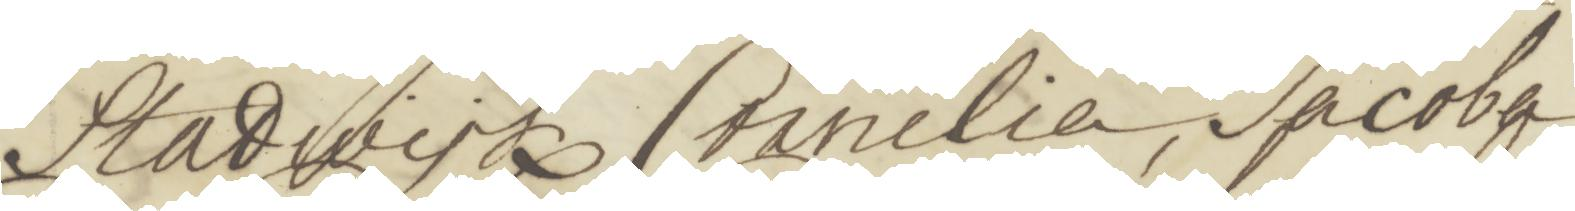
Stadwijk Cornelia, Iacoba,
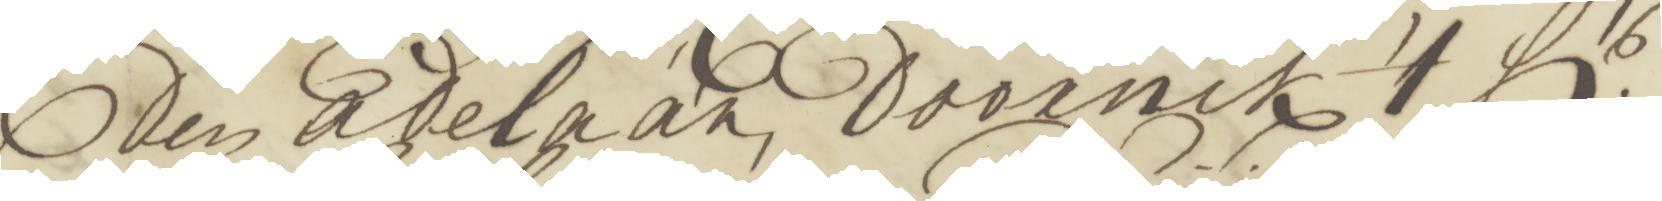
den adelaar, doornik ’t H:s
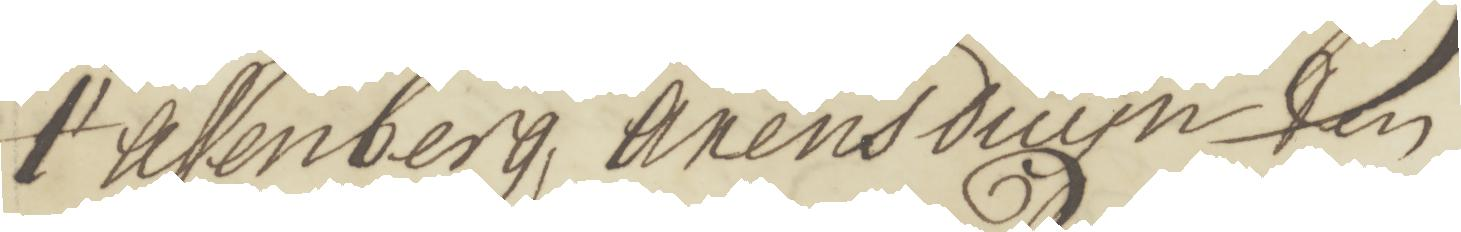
t' assenberg, arensduijn den
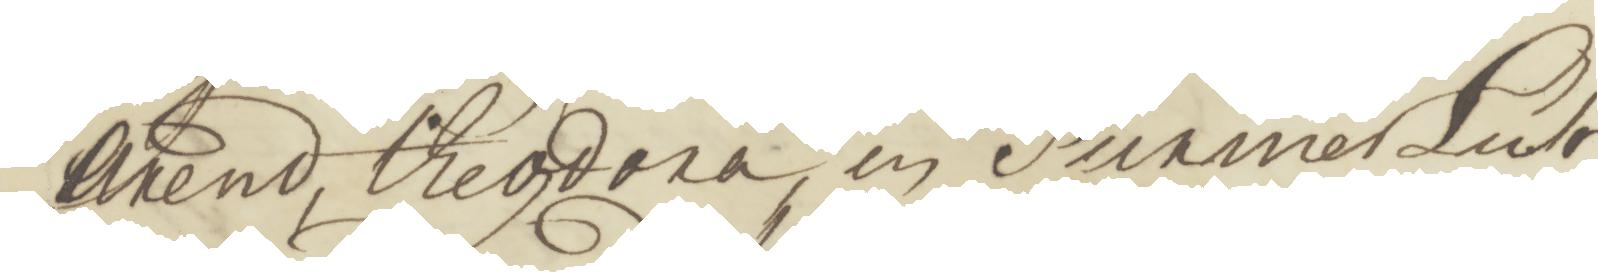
arend, theodora, en Purmer Luts
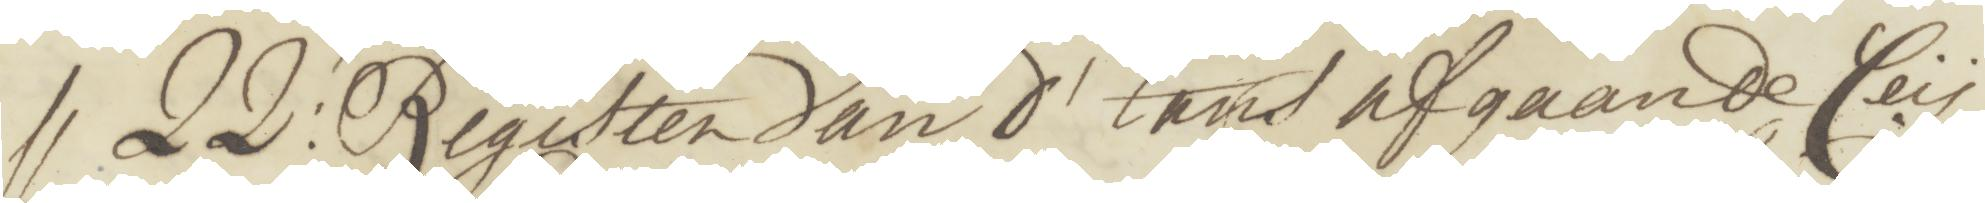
„ 22: Register van d’ tans afgaande Ceij
